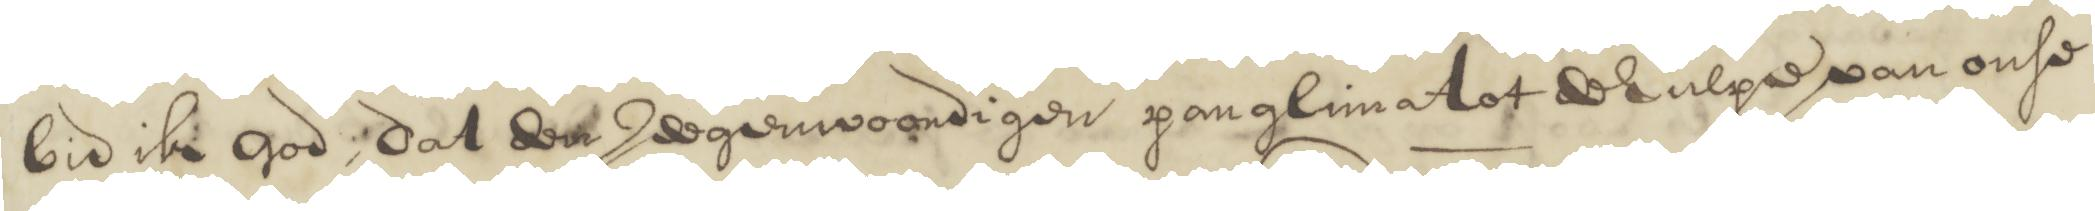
bid ik god , dat den jeegenwoordigen panglima tot de hulpe van onse
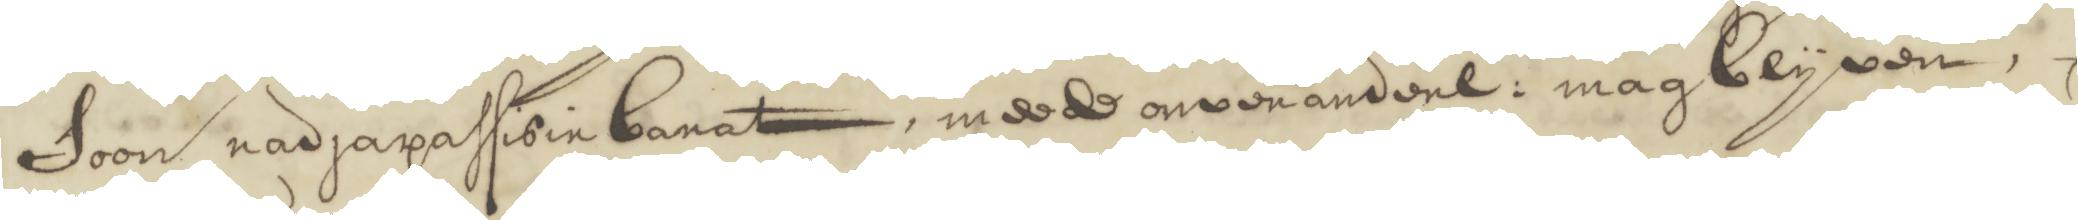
Soon radjapassisir barat , meede onver anderl: mag blijven,—
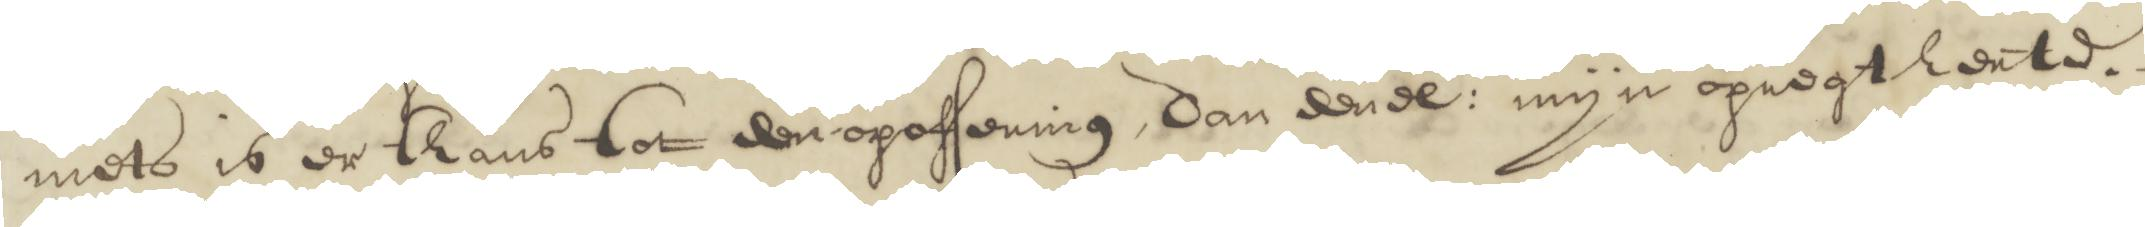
niets is er thans tot een opoffering, dan een el: mijn opregt herte.—
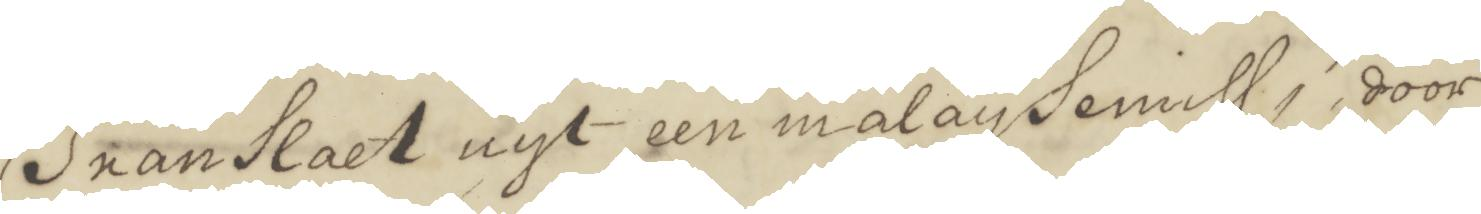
Translaet uijt een malaijsemiss„e , door
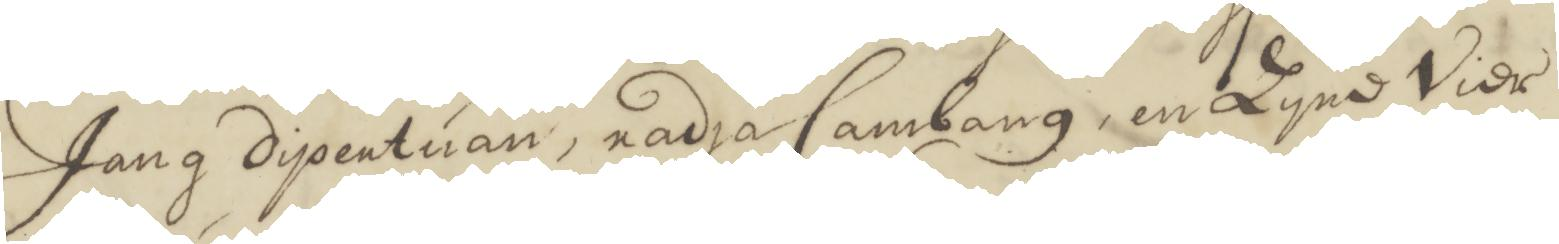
Jang dipertuan , radja Cambang, en Zijne Vier
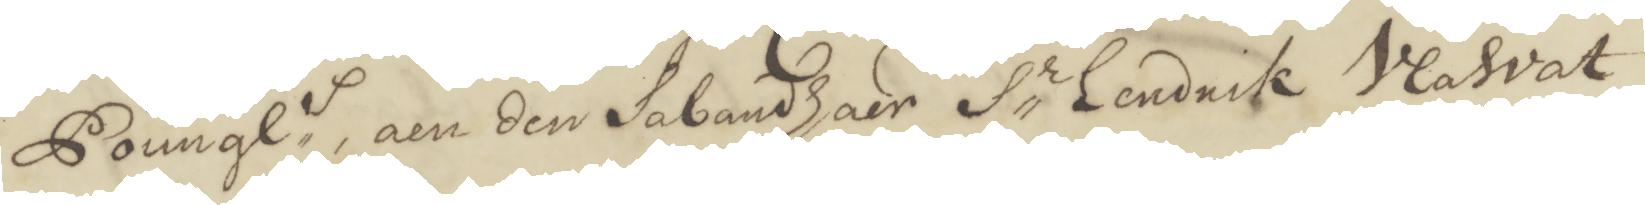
Poungl„s , aen den Sabandhaer S„r hendrik Vlasvat
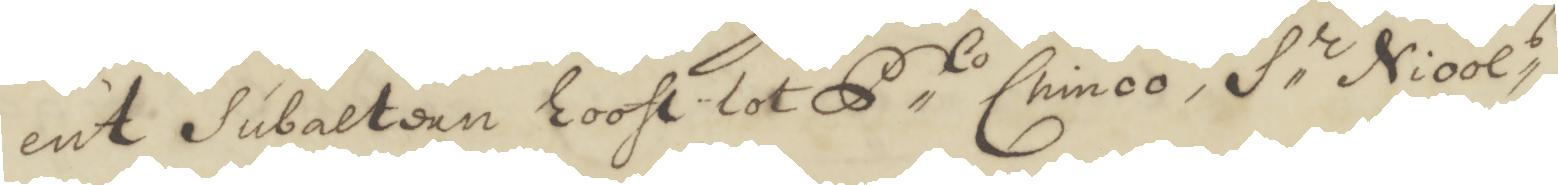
en’t Subaltern hooft tot P„lo Chinco , S„r Nicol„s
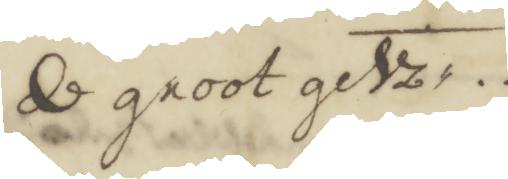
de groot gesz„.
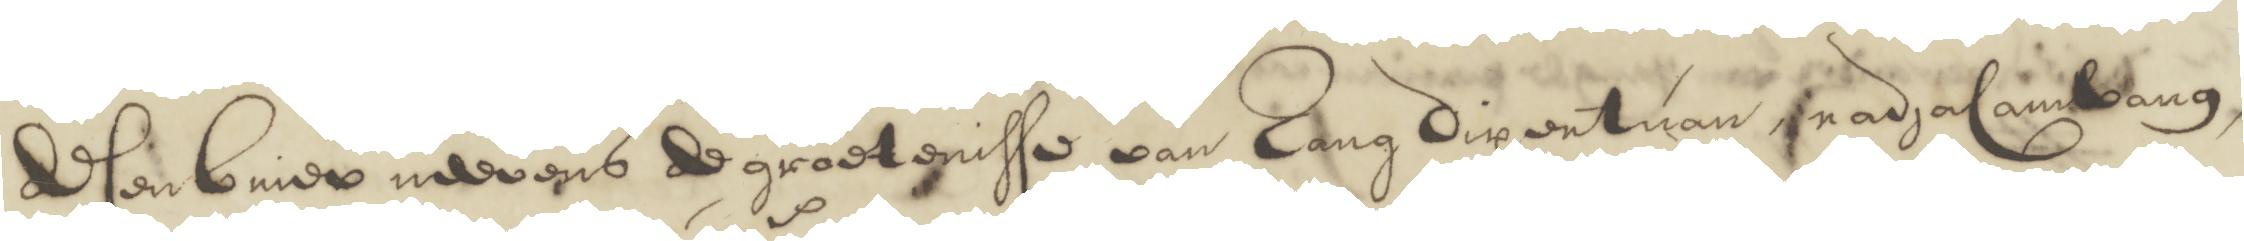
desen briev neevens de groetenisse van Iang dipertuan , radja Cambang,
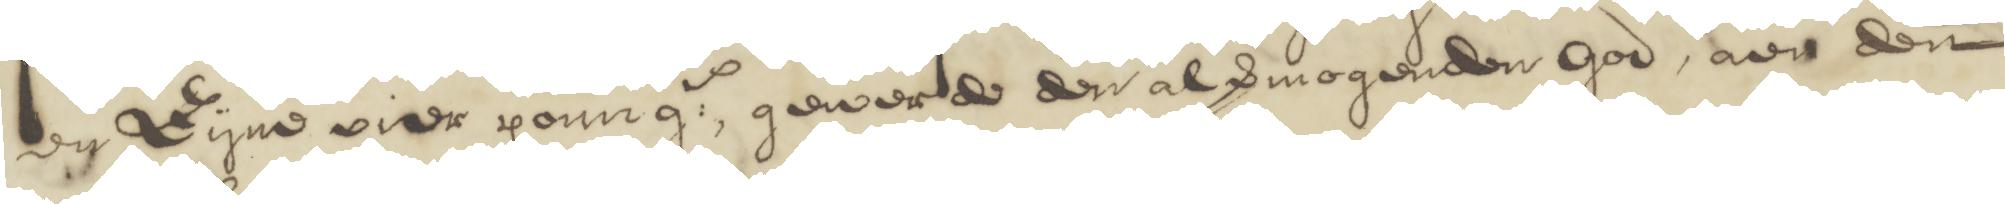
en Zijne vier poung:s , gewerde den al vermogenden god, aen den
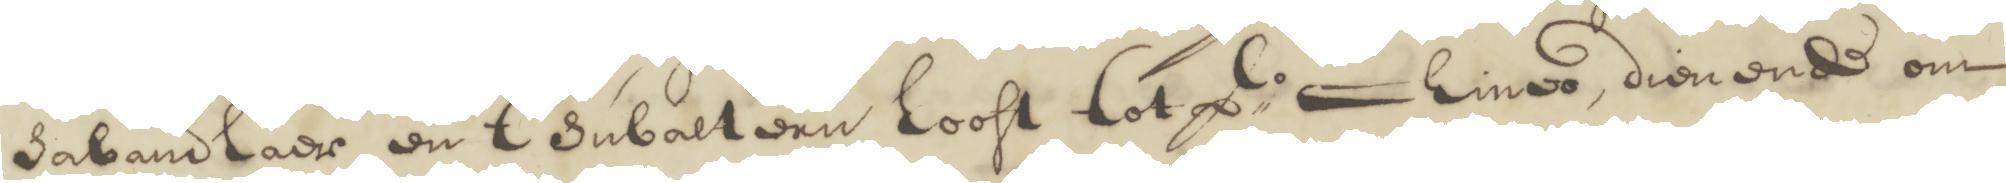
sabandhaer en ’t subaltern hooft tot p:lo chinco , dienende om
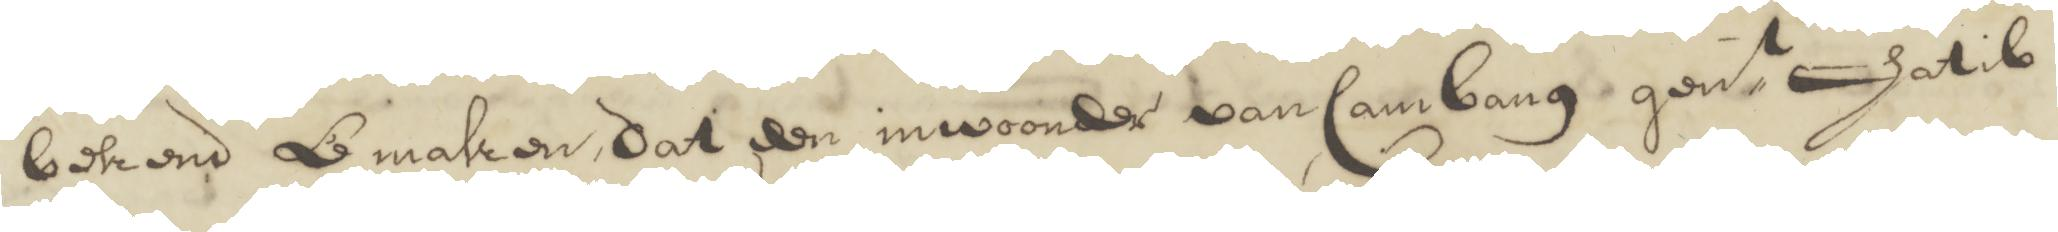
bekend te maken, dat een inwoonder van Cambang gen„t Chatib
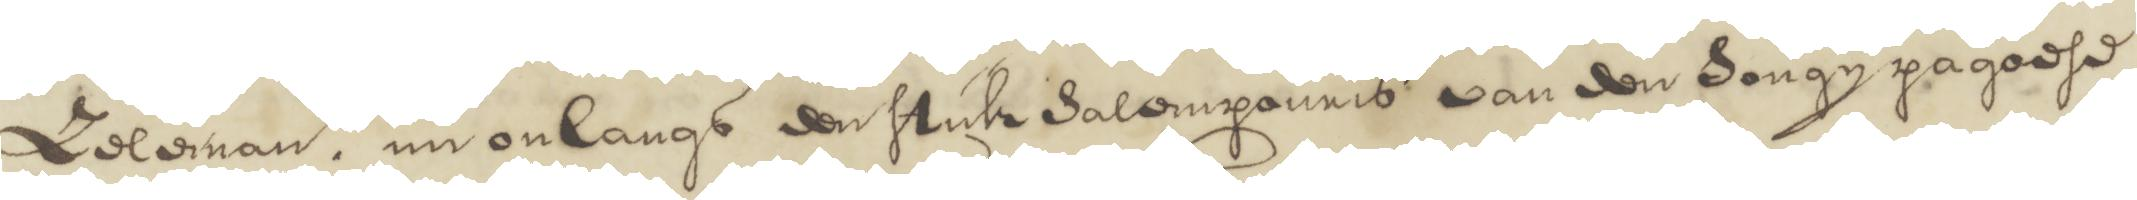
Zeleman, nu onlangs een stuk Salempouris van een Songij pagoese
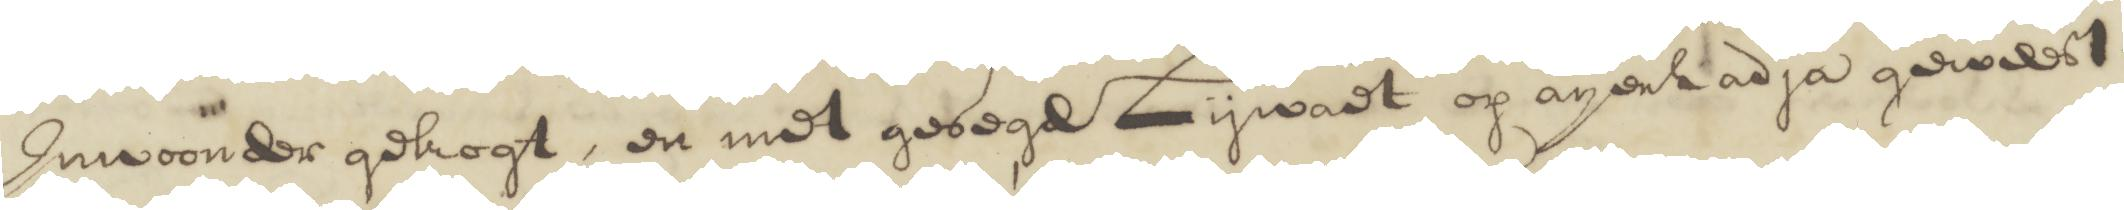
Inwoonder gekogt, en met gesegde Lijwaet op aijerhadja geweest
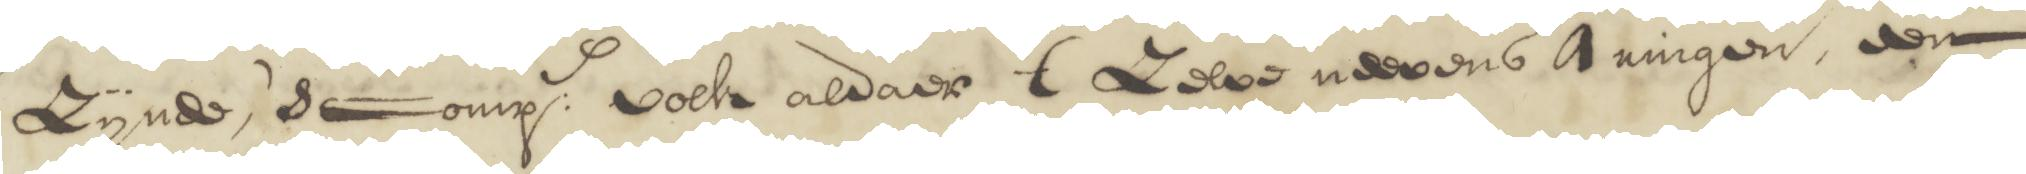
Zijnde, ’s Comp:s volk aldaer ’t Zelve neevens 4 ringen , een
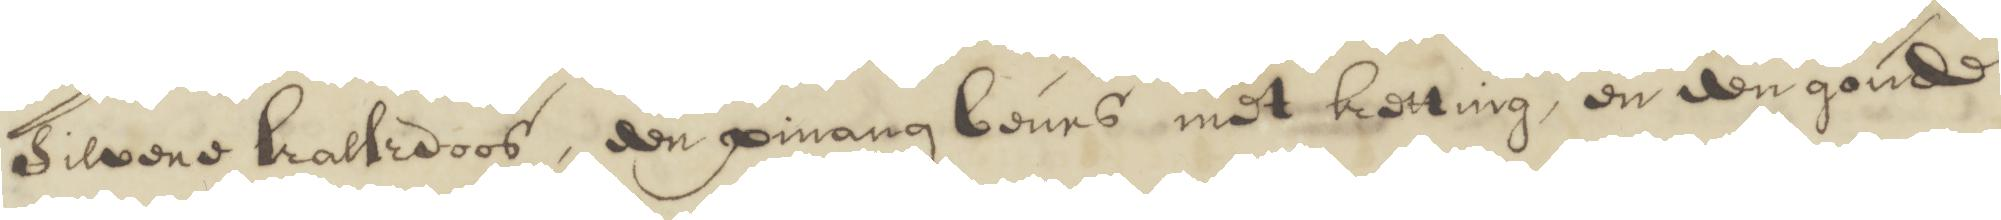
silvere kalkdoos, een pinang beurs met ketting, en een goude
